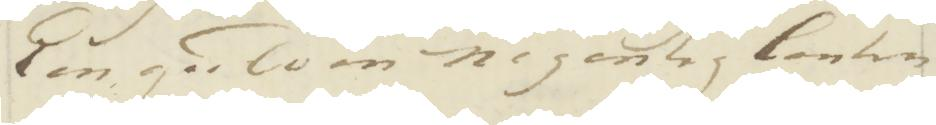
Een gulden negentig Cent
